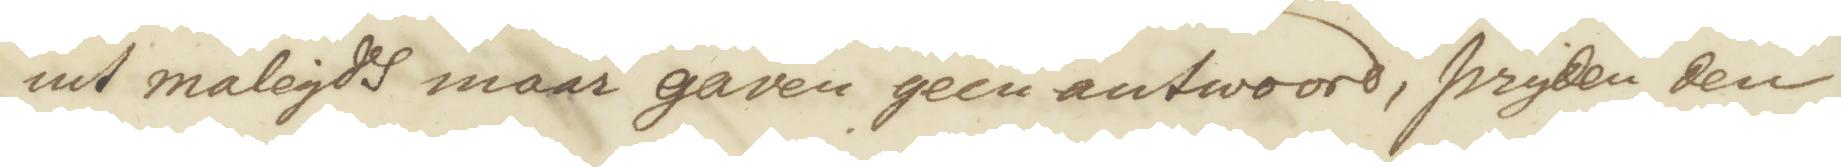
in’t maleijds maar gaven geen antwoord, prijden den
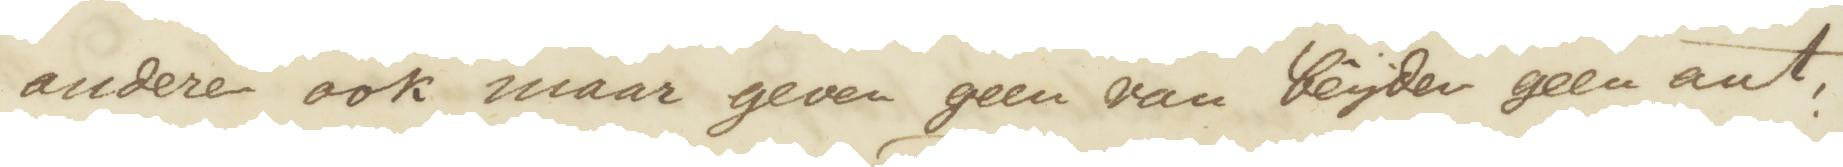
andere ook maar geven geen van beijden geen ant,
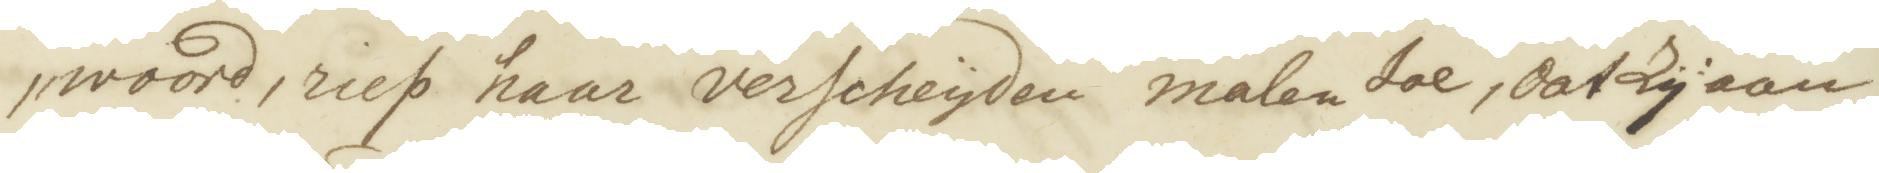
„woord, riep haar verscheijden malen soe, dat zij aan
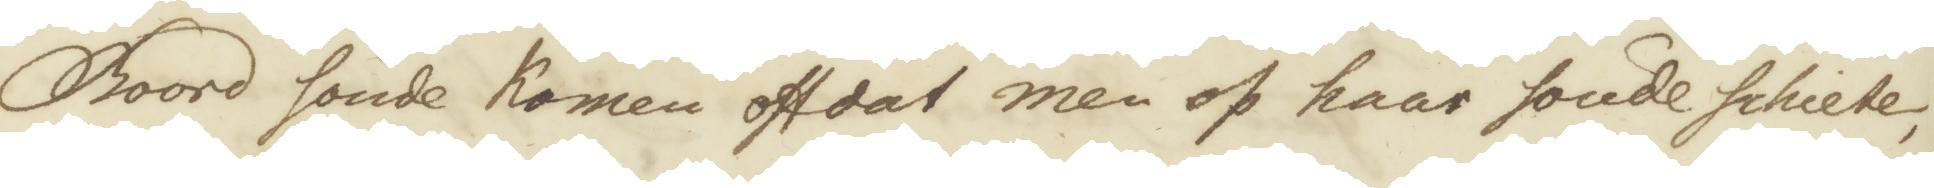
Boord soude komen off dat men op haar soude schiete,
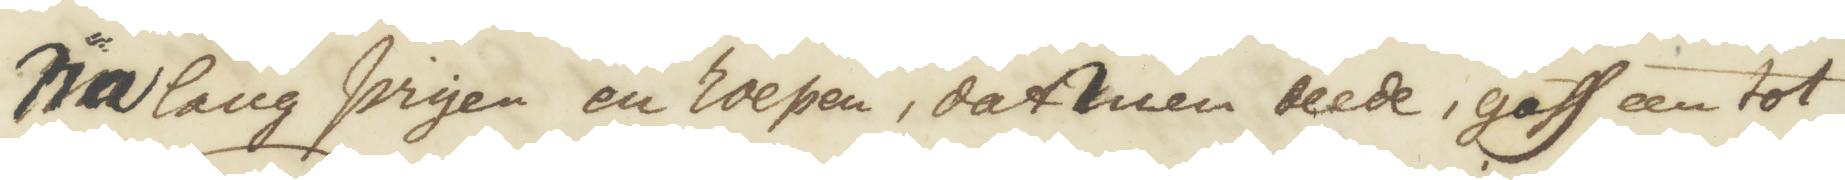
Na lang prijen en roepen, dat men deede, gaff een tot
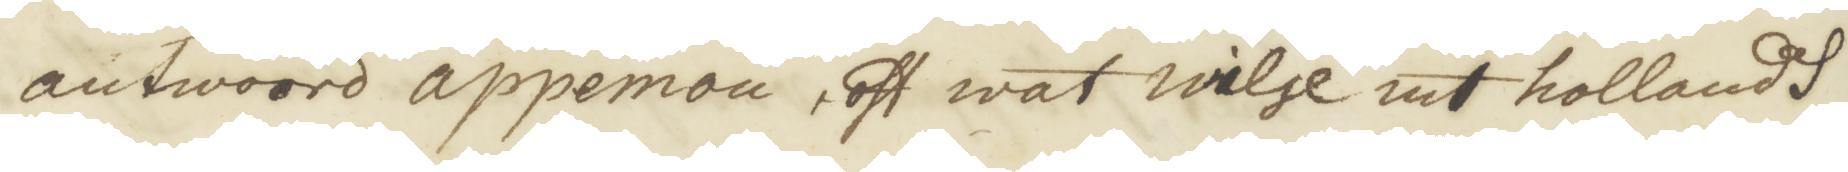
antwoord appemou, off wat wilje in't hollands
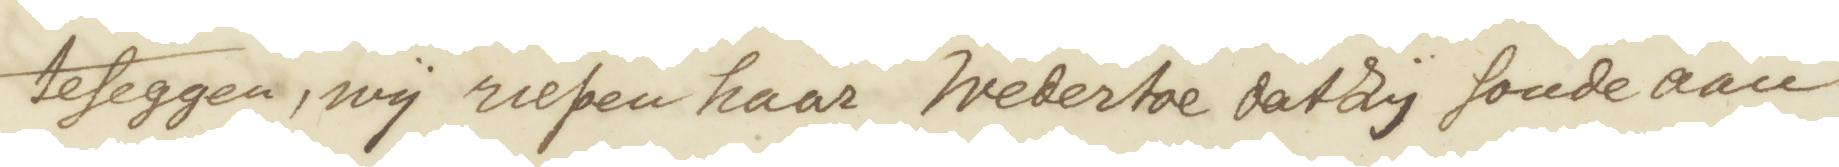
teseggen, wij riepen haar wedertoe datzij soude aan
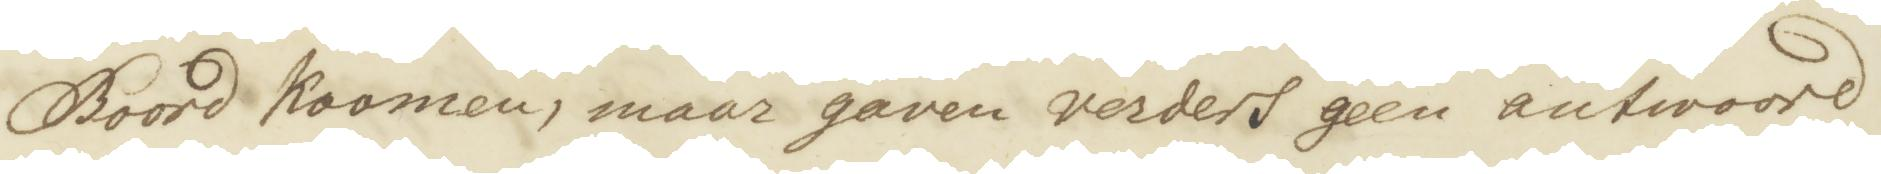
Boord koomen, maar gaven verders geen antwoord
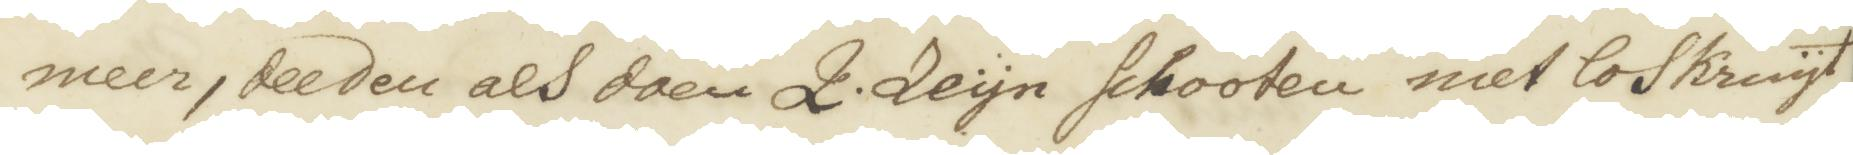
meer, deeden als doen 2.zeijn schooten met los kruijt
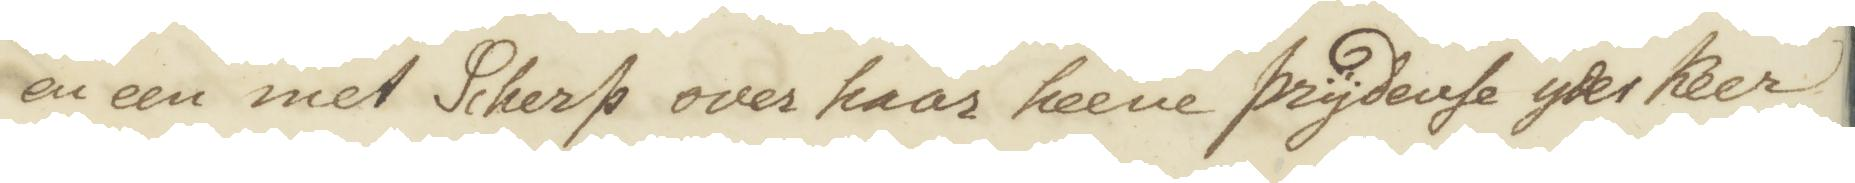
en een met scherp over haar heene prijdense ijder keer
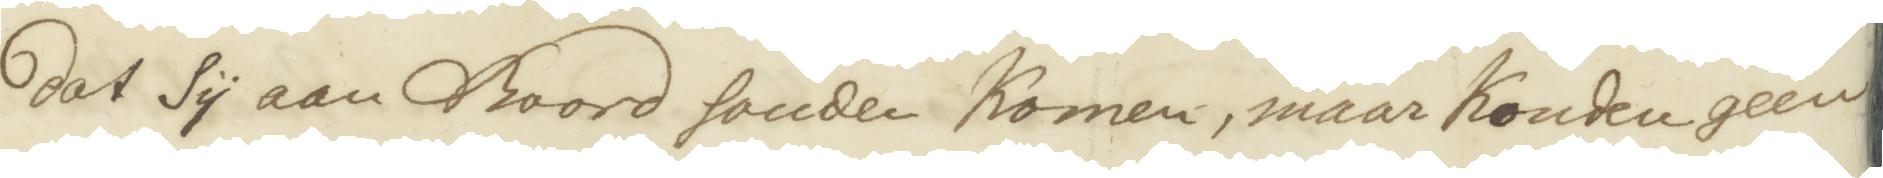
dat sij aan Boord souden komen, maar konden geen
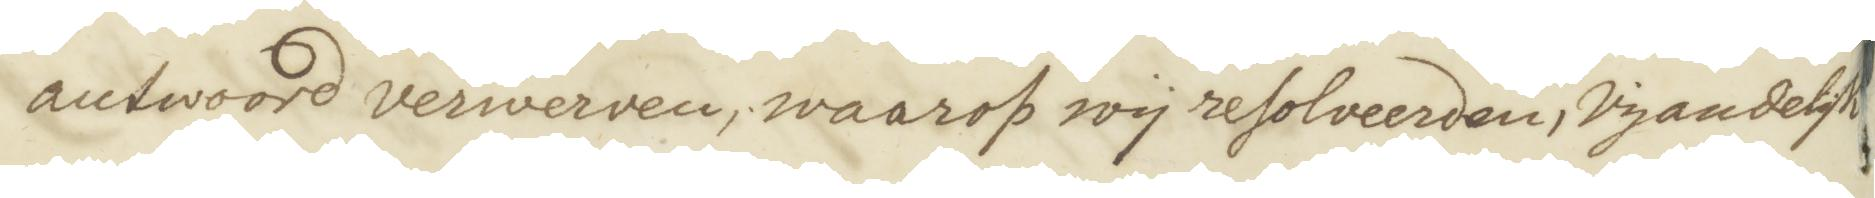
antwoord verwerven, waarop wij resolveerden, vijandelijk
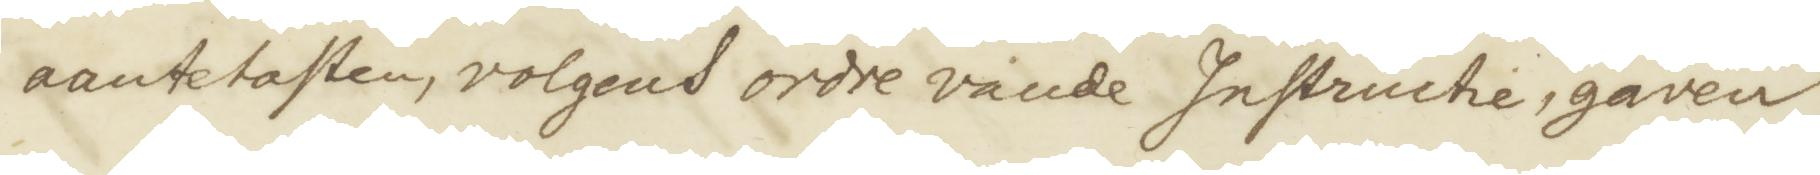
aan te tasten, volgens ordre van de Instructie, gaven
